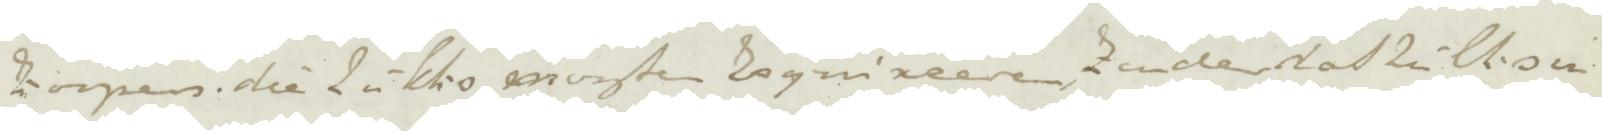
koopers, die zulcks mogten requireeren Zoude dat zulks in
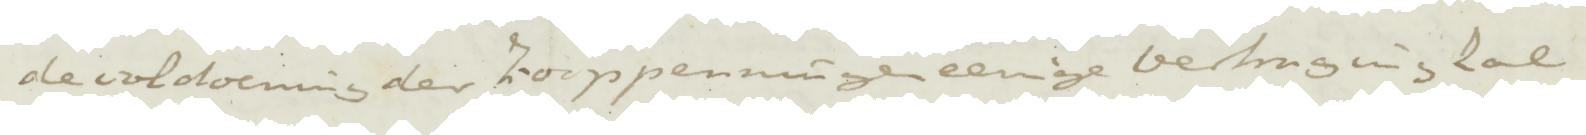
de voldoening der kooppenningen eenige vertraging Zal
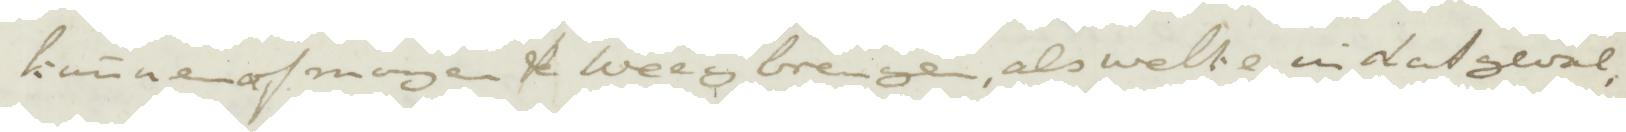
kunnen of mogen te weeg brengen, als welke in dat geval,
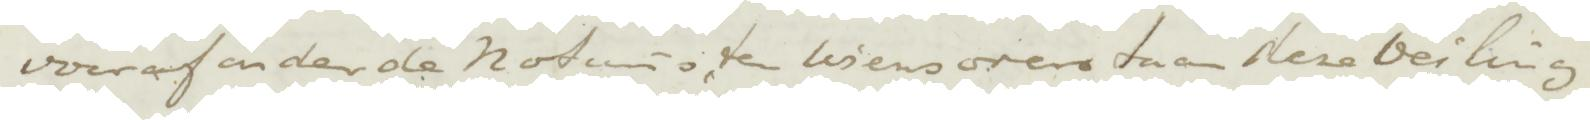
vooraf onder de Notaris ten wiens overstaan deze veiling
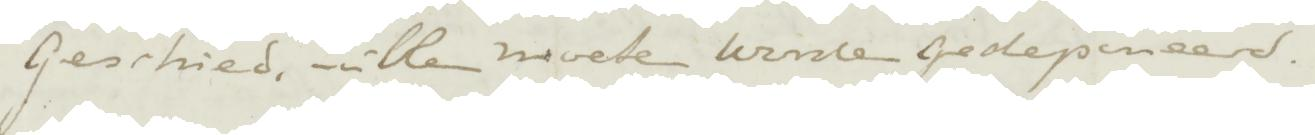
geschied, zullen moeten worden gedeponeerd.
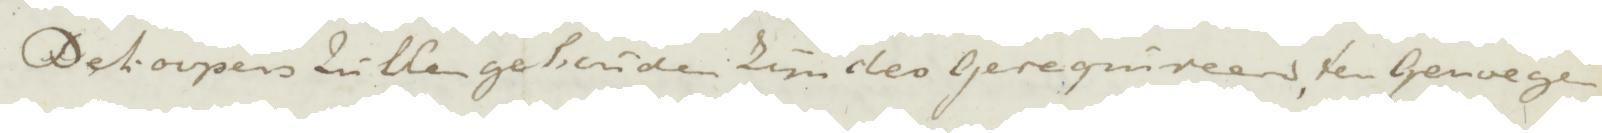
De koopers zullen gehouden zijn des Gerequireerd, ten Genoegen
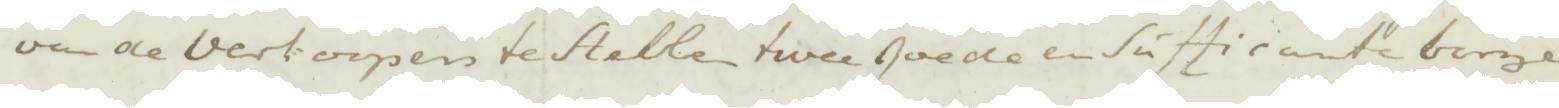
van de verkoopers te stellen twee goede en sufficante borgen,
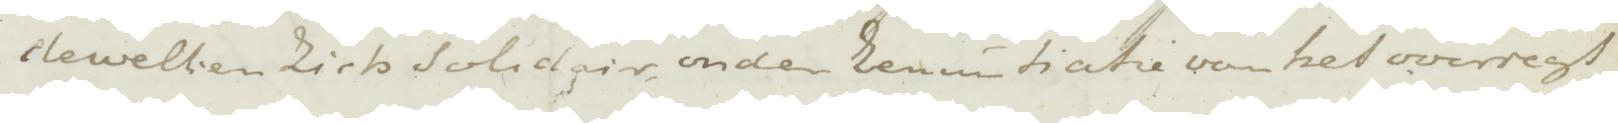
dewelken zich soldair onder renuntiatie van het overregt
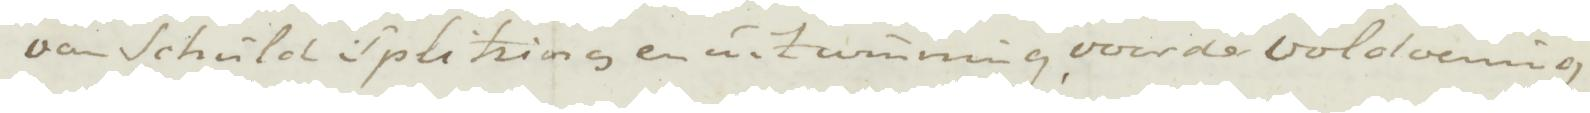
van Schuld splitsing en uitwinning voor de voldoening
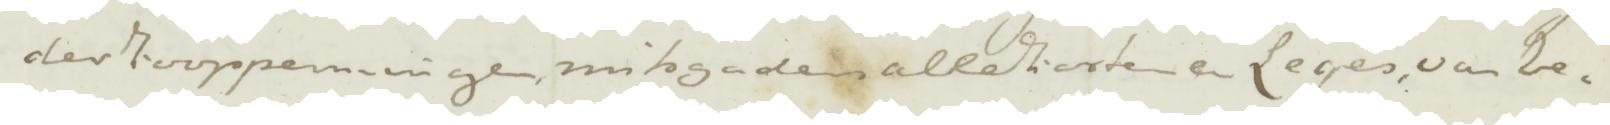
der Kooppenningen mitsgaders alle kosten en leges, van re=
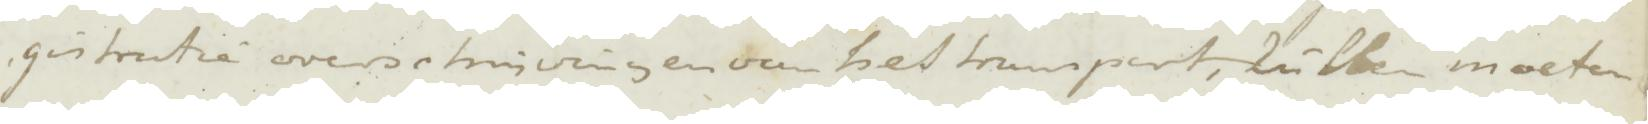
„gistratie overschrijving en van het transport, zullen moeten
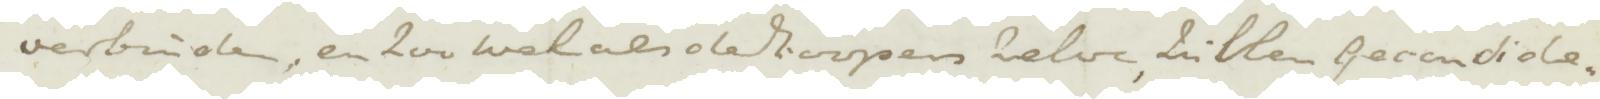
verbinden, en zoo wel als de kopers zelve zullen gecondide=
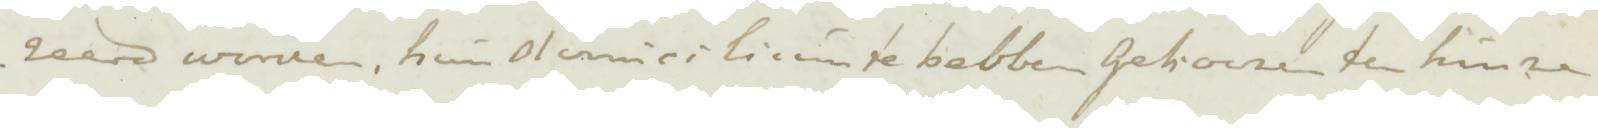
=reerd worden, hun domicilieën te hebben gekozen ten huize
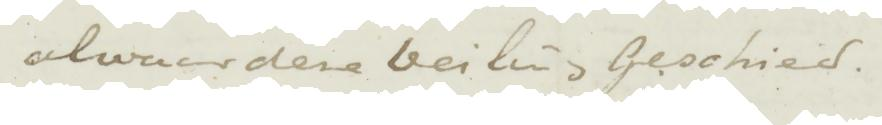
alwaar deze veiling geschied.
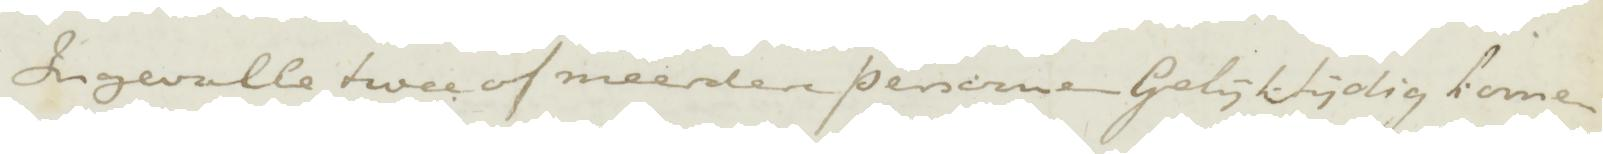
Ingevalle twee of meerden personen gelijktijdig komen
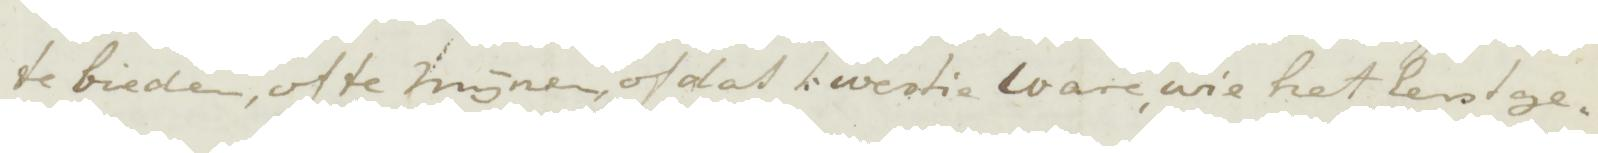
te bieden, of te mijnen, of dat kwestie ware wie het Eerst ge=
